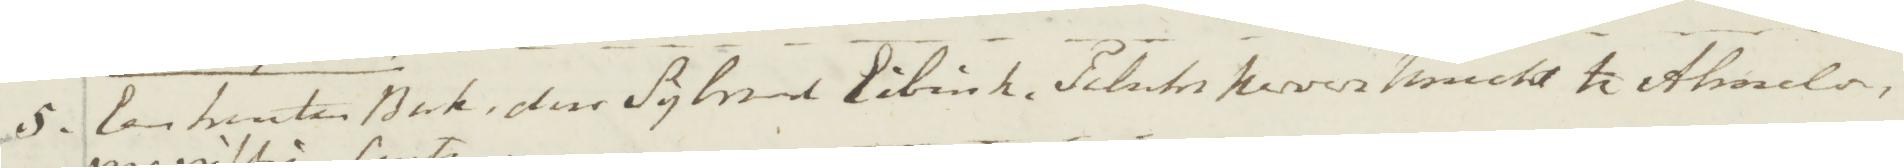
5. Een houten Bak, door Sijbrand Eibink. Schultskerversknecht te Almelo,
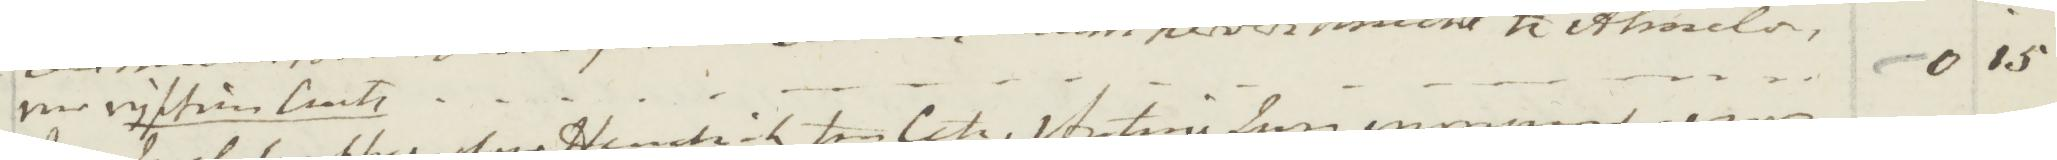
voor vijftien Cents- - - - - - - - - - - - - - - - - - - - — 0 15
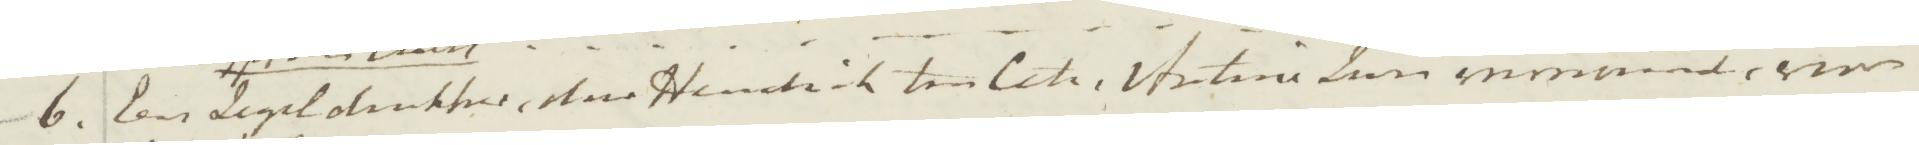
6. Een zegeldrukpers, door Hendrik ten Cate, Antoni zoon voornoemd voor
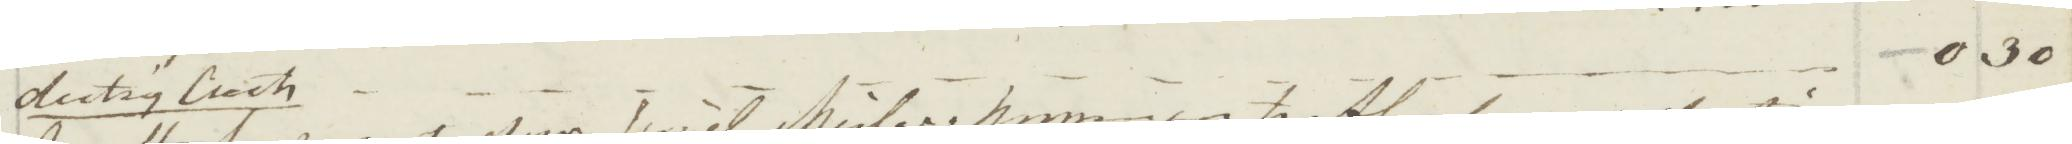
dertig Cents - - - - - - - - - - -- - - - -- - - -- - -- - - - — 0 30
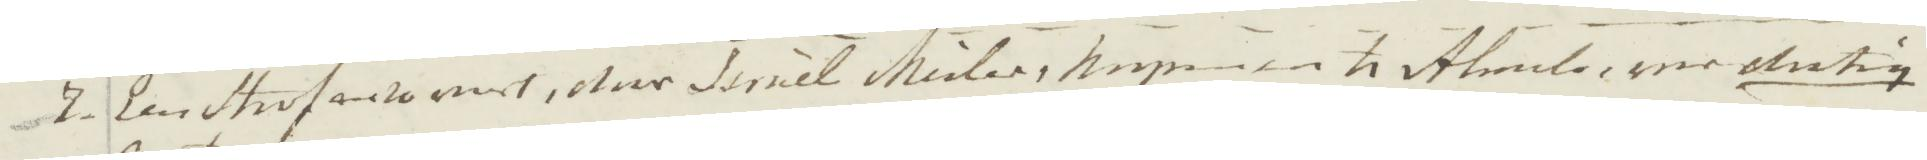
7„ Een stoof ante voort, door Israel Muler, koopman te Almelo, voor dertig
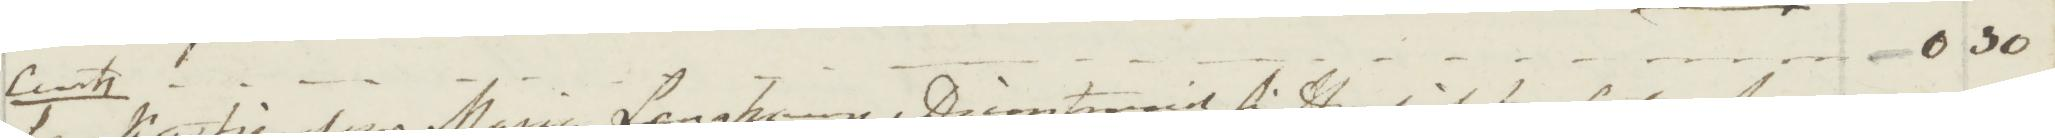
Cents - - - - - - - - - - - - - - - - - - - - - - - -- - - - - - — 0 30
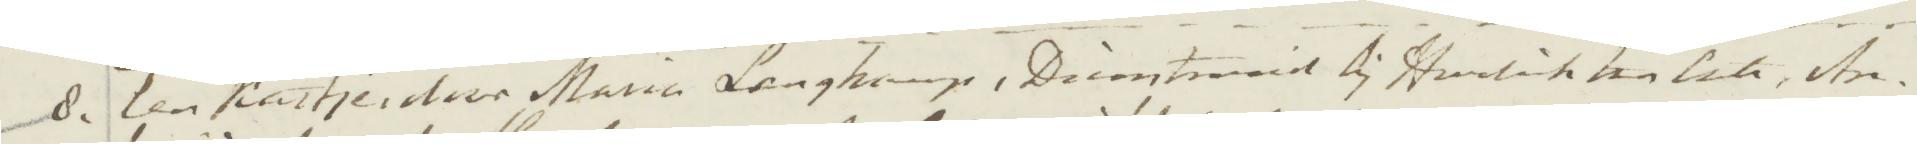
8. Een Kastje, door Maria Langkamp, Dienstmeid bij Hendrik ten Cate, An-
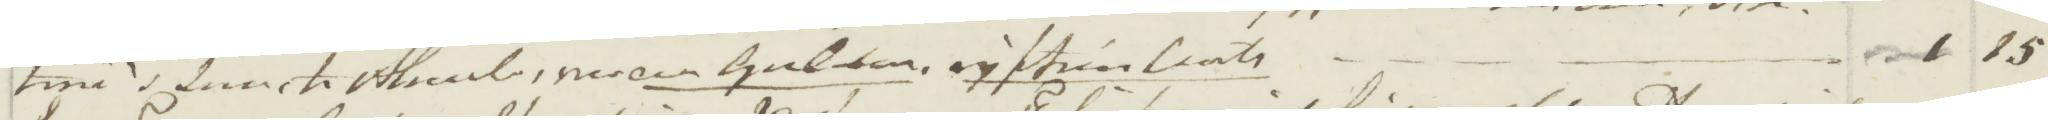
toni 's Zoon te Almelo, voor een Gulden vijftien Cents „ 1 15
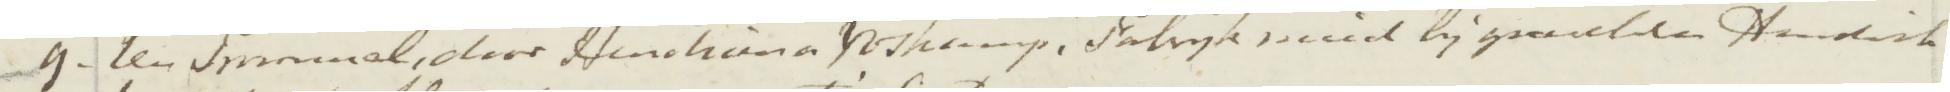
9. Een Trommel, door Hendrina Voskamp, Falbriekmeid bij gemelden Hendrik
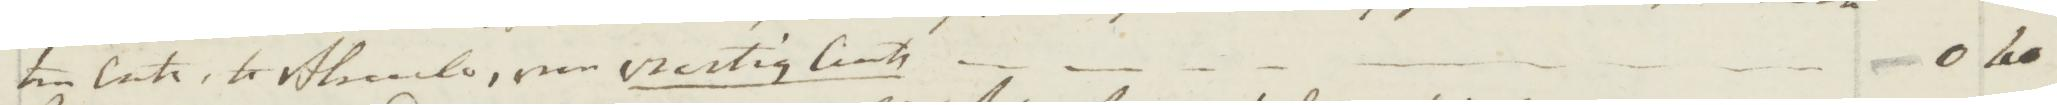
ten Cate, te Almelo, van veertig Cents - - - - - -- - - - - - - - — 0 40
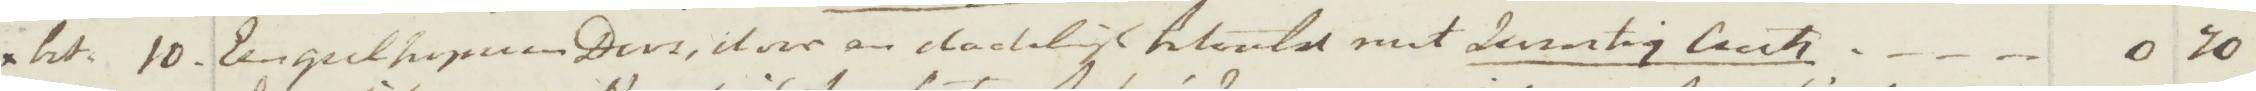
Art.10. Een geelkoperen Door, door en dadelijk btaald met Zeventig Cents-- - - 0 70
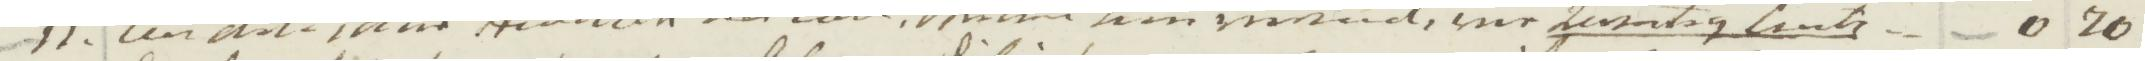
11. Een dito, door Hendrik ten Cate, Antonizoon voorzeid, van Zeventig Cents - - - 0 70
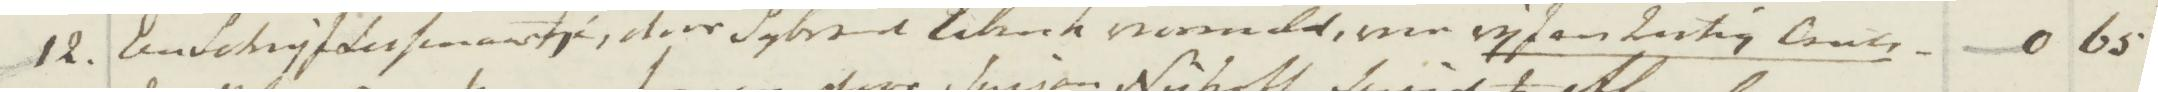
12. Een schrijf Lessenaartje, door Sybrand Eibink voormeld, voor vijfen Zestig Cents - -0 65
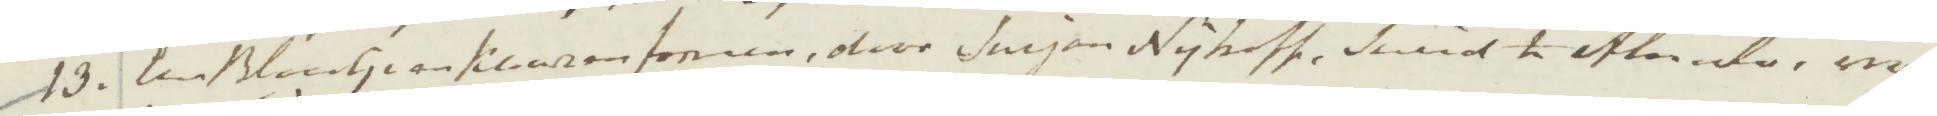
13. Een Blaartje en kaarzen formen, door Jurjen Nijhoff, Smid te Almelo, voor
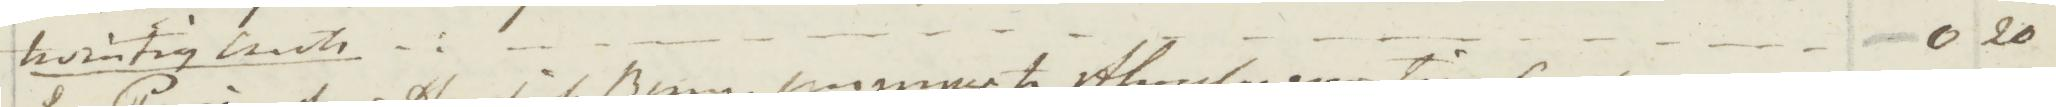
twintig Cents - - - - - - - -- - - - - -- - - - - - -- - - - -- - - -- - - - -- - - - - —-: 0 20
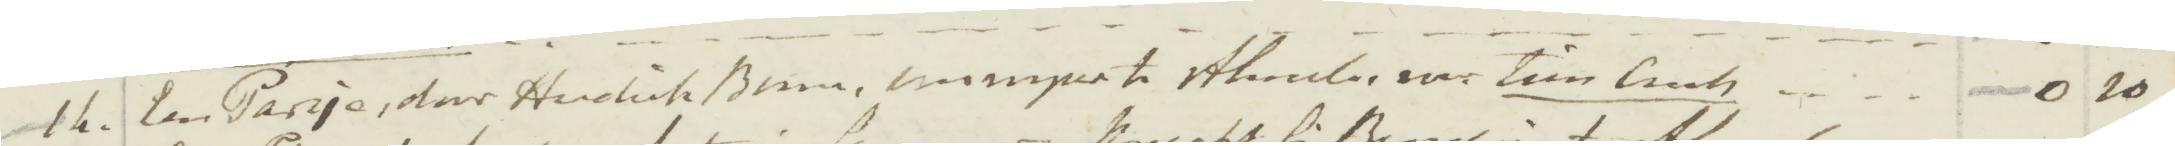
14. Een Parije, door Hendrik Boom, O... per te Almelo, voor tien Cents -0 20
